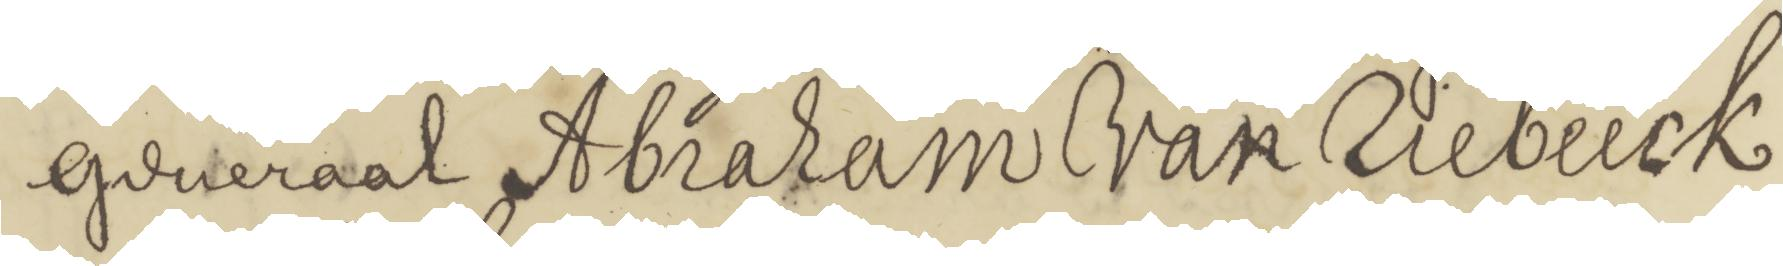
generaal Abraham van riebeeck
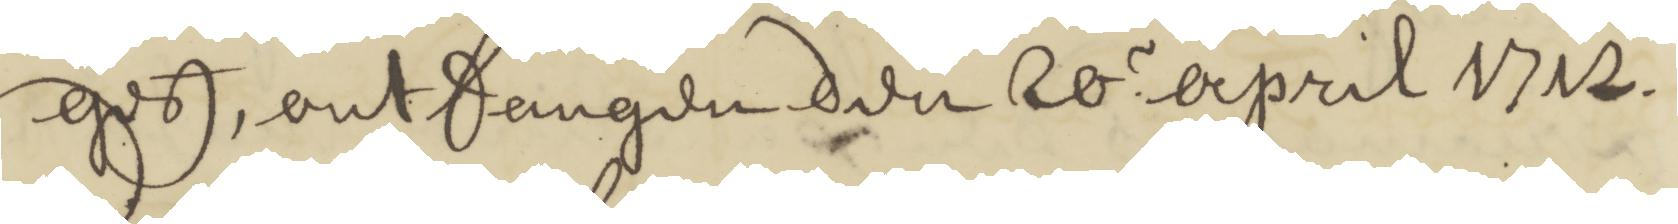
ges: , ontfangen den 20.e april 1712.
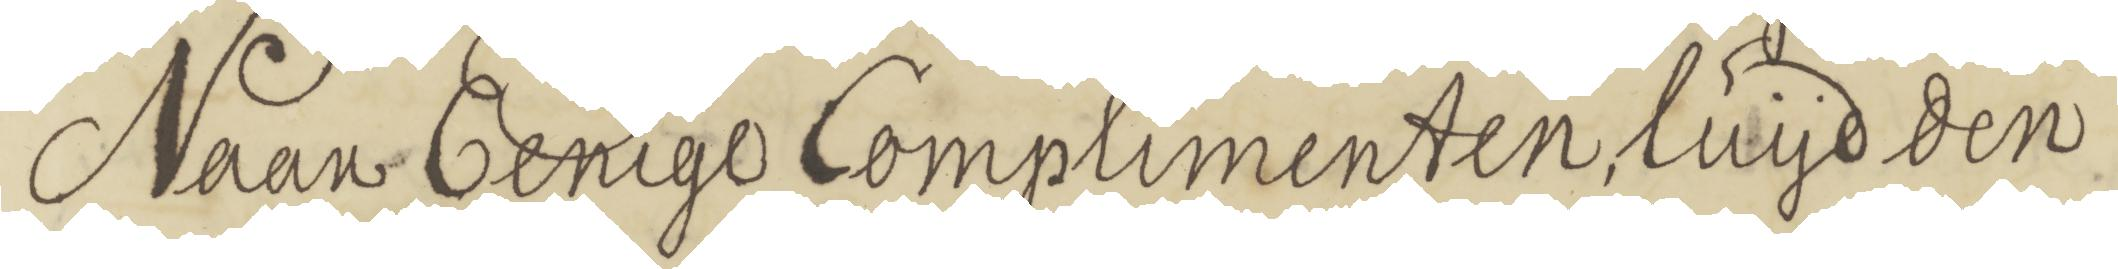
Naar Eenige Complimenten, luijd den
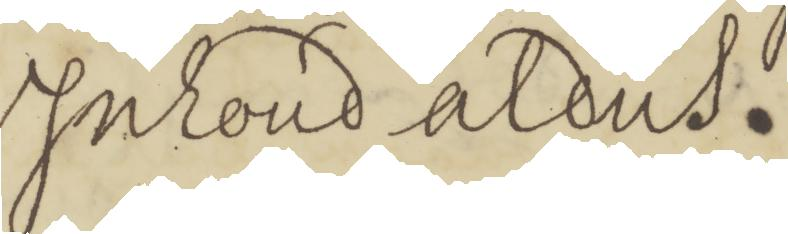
Inhoud aldus.
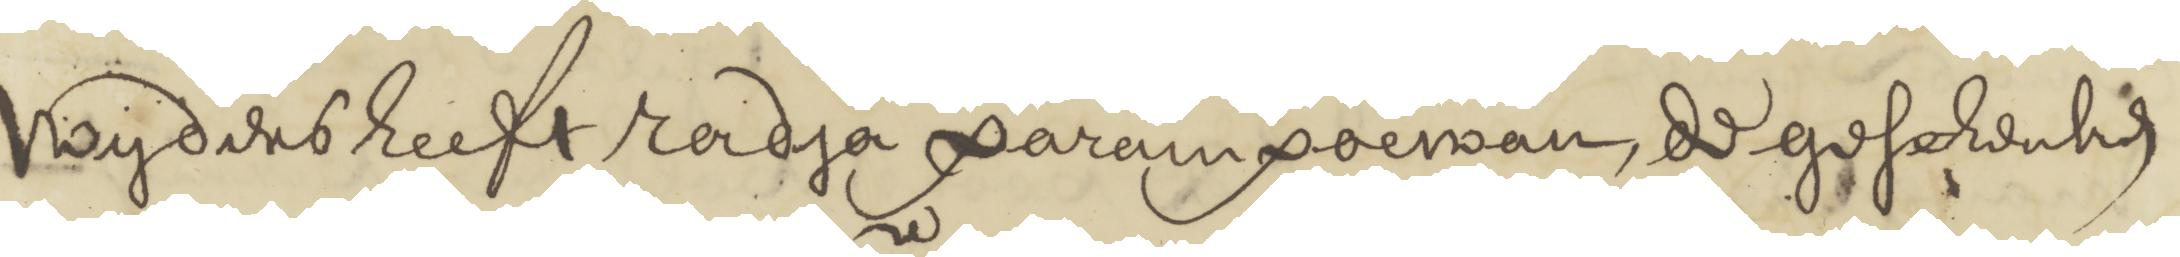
Wijders heeft radja parampoewan, de geschenken
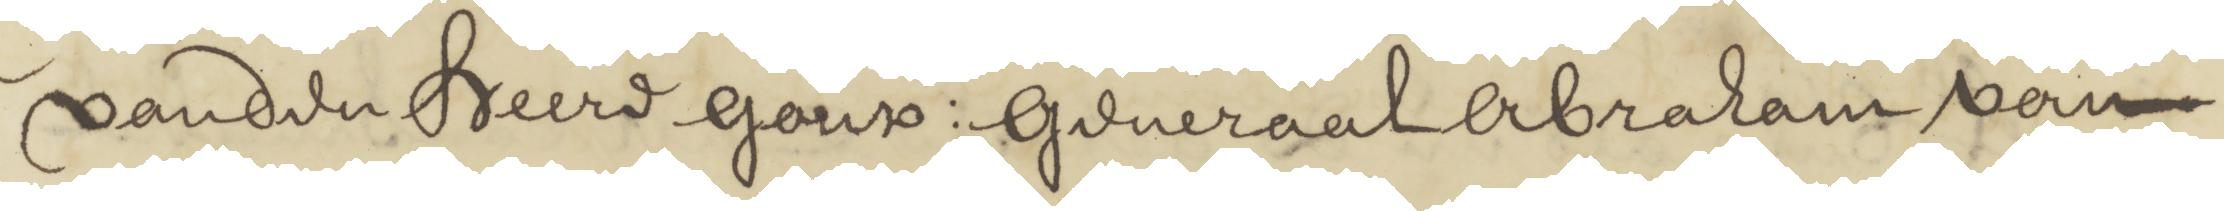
van den Heere gouv:r generaal abraham van
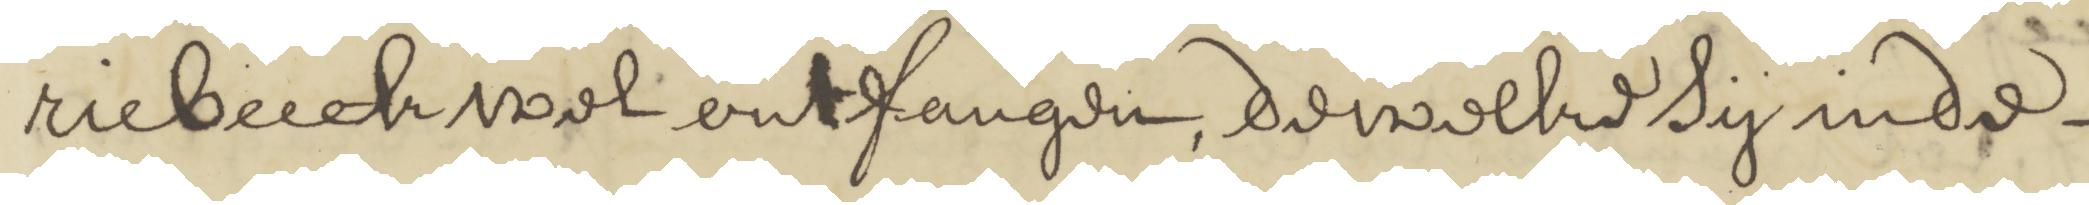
riebeeck wel ontfangen, dewelke Sij inde —
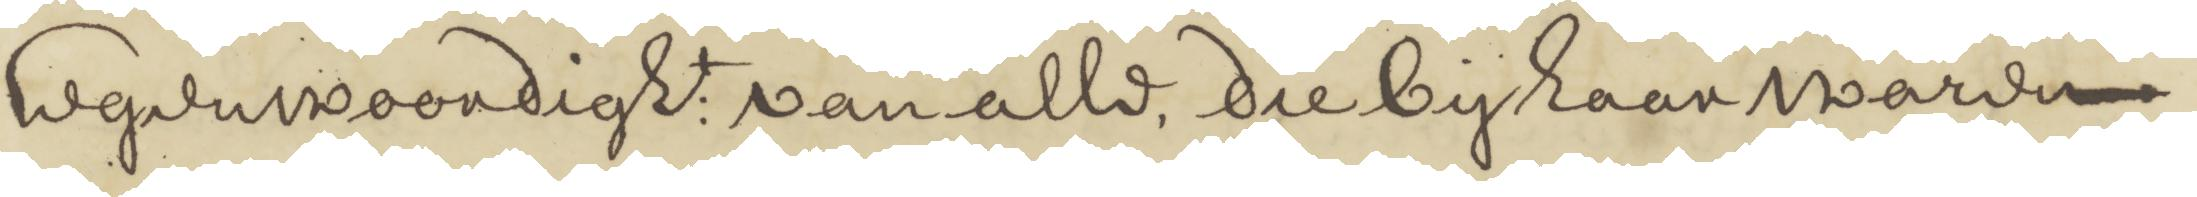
tegenwoordigh:t van alle, die bij haar waren
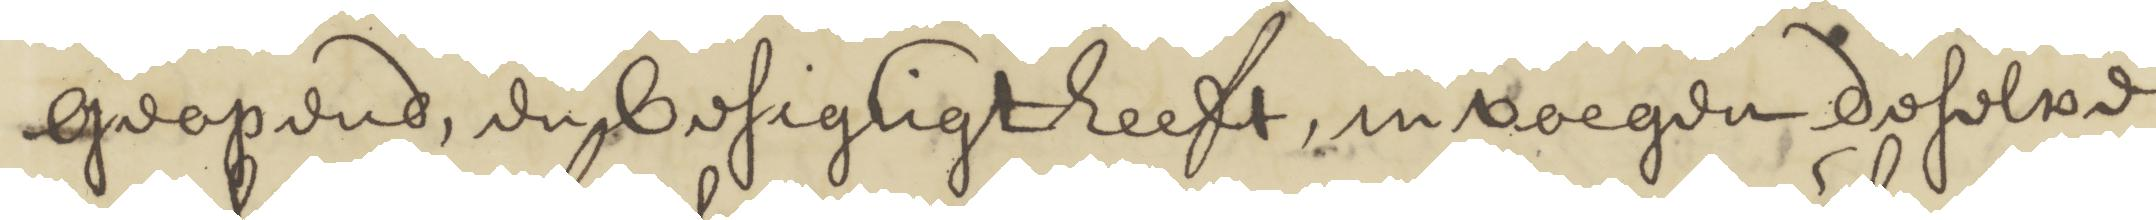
geopend, en besigtigtheeft , in voegen deselve
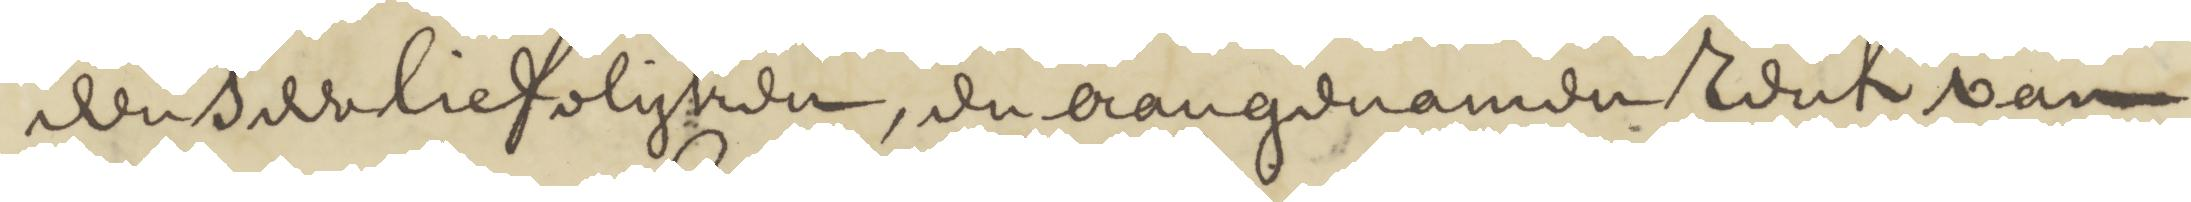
een seerliefelijken, en aangenamen Reuk van
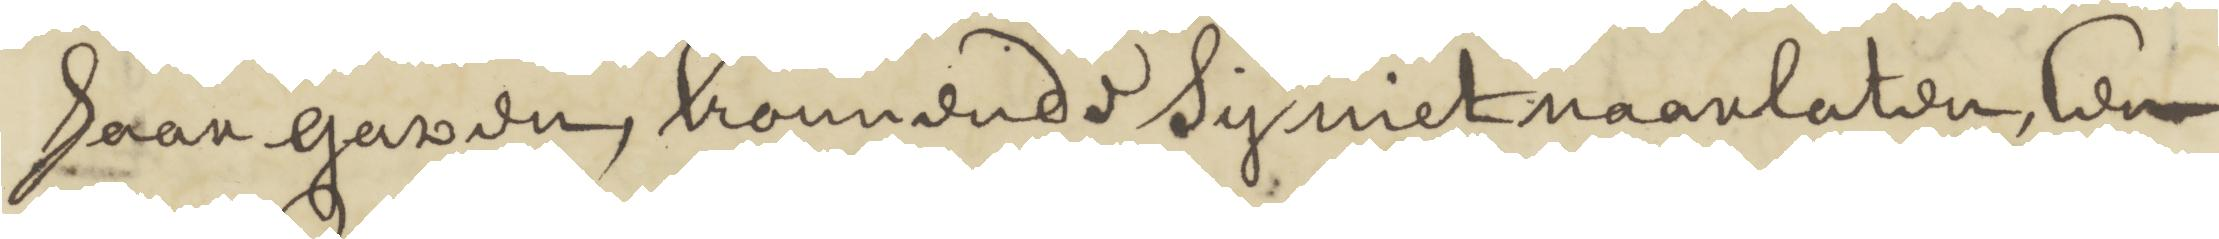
haar gaven, konnende Sij niet naarlaten, ten
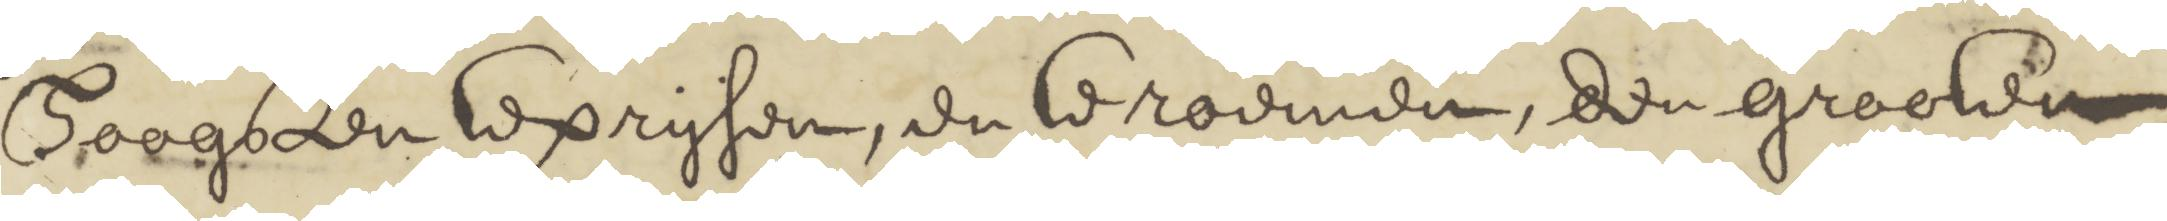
hoogsten teprijsen, en te roemen, den grooten
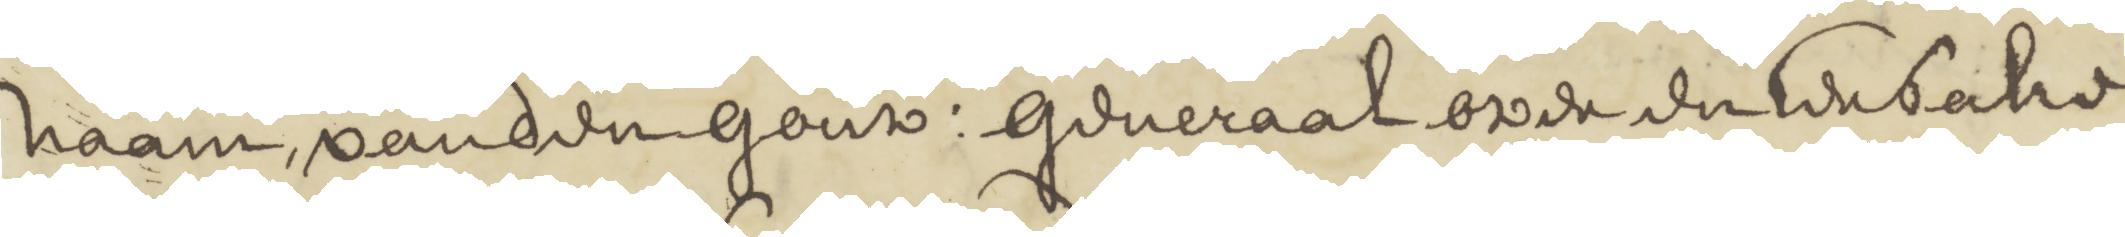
naam, van den gouv:r generaal over en tersake
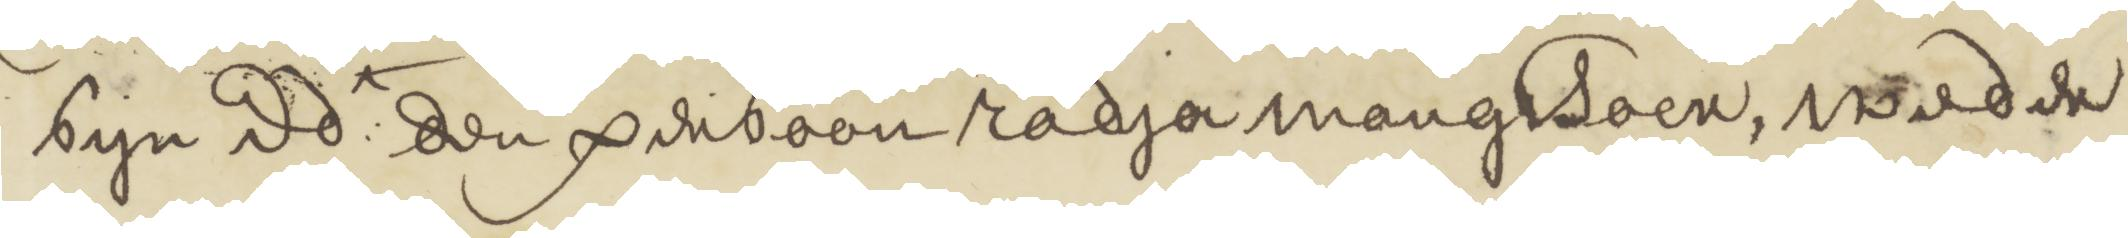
sijn Ed:t den persoon radja mangtsoer, weder
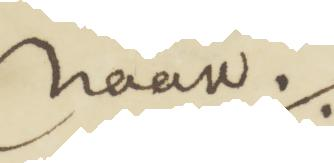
naar.
